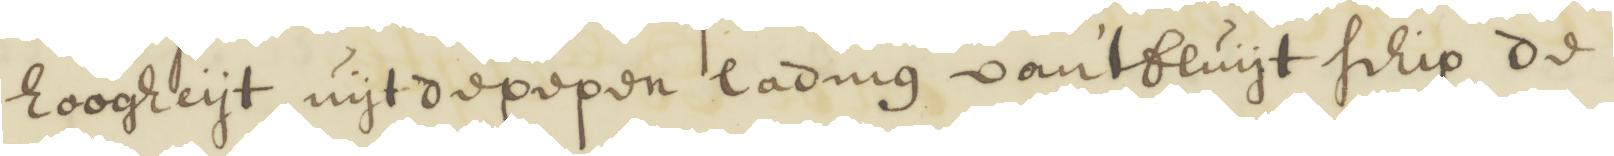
hoogheijt, uijt depeper lading van ’tfluijt schip de
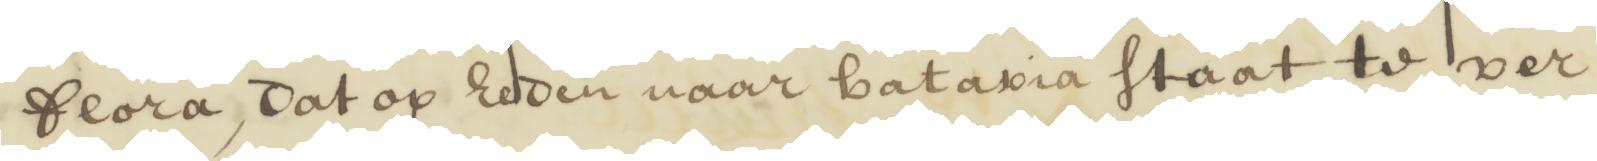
flora, dat op heden naar batavia staat te ver
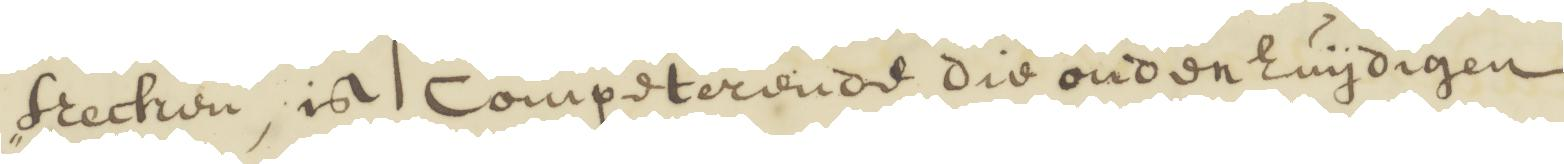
„trecken, is Competerende die onder huijdigen
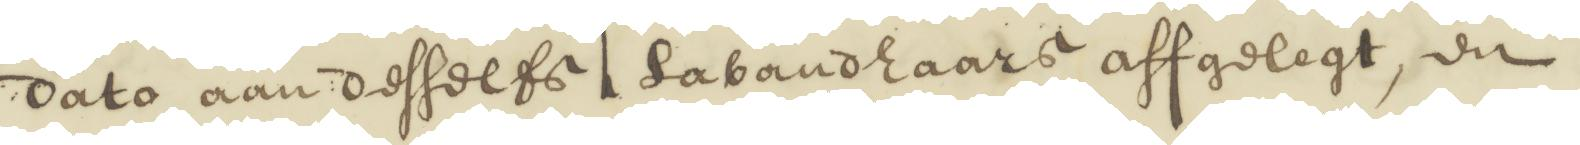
dato, aan desselfs sabandhaars affgelegt, en
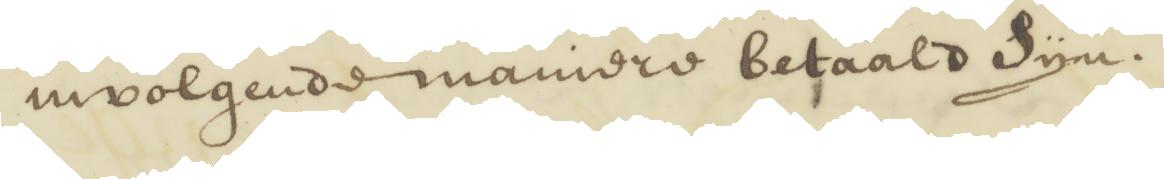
involgende maniere betaald sijn.
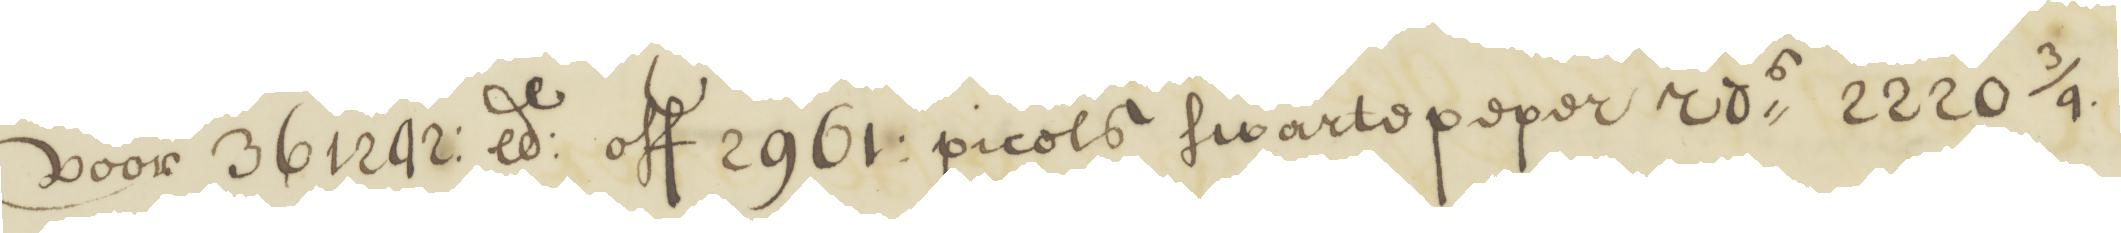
Voor 361242: ede: off 2961: picols swarte peper rd„s 2220¾.
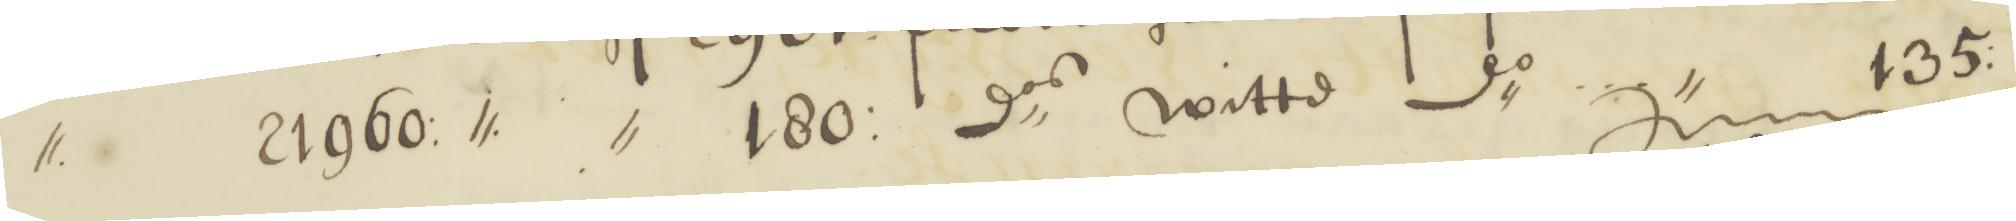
„. 21960: „ „ 180: d„os witte d„o - - - „135:
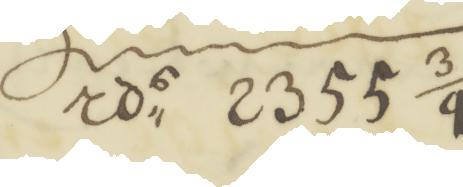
rd„s 2355¾
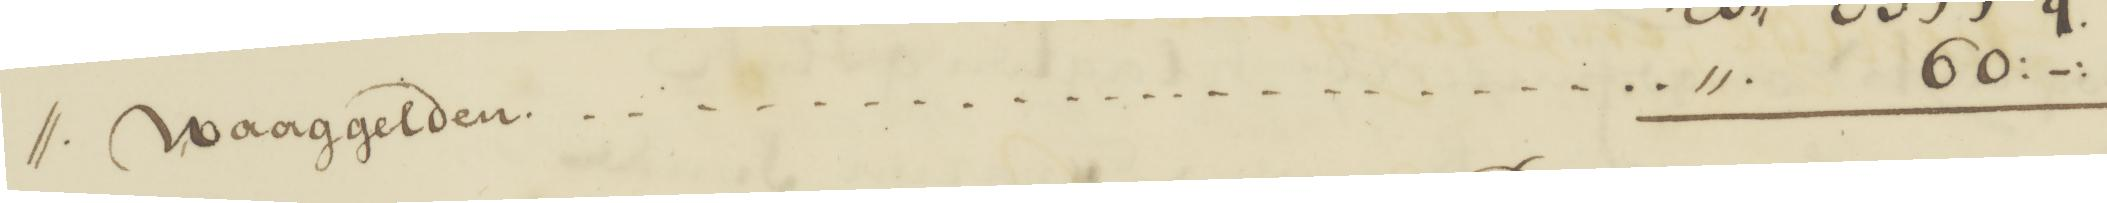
„. Waaggelden. - - - - - - - - - - - - - - - - - - - - - - „. 60: —:
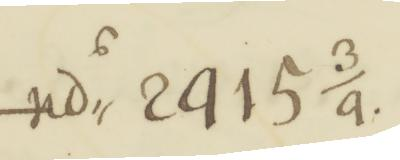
rd„s 2415¾.
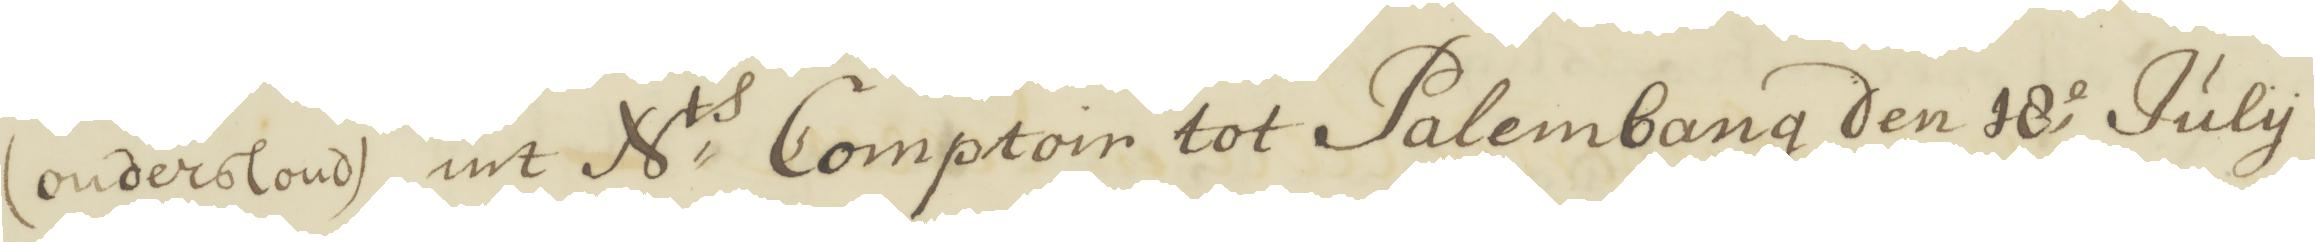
(onderstond) in't N„ts Comptoir tot Palembang den 18„e Iulij
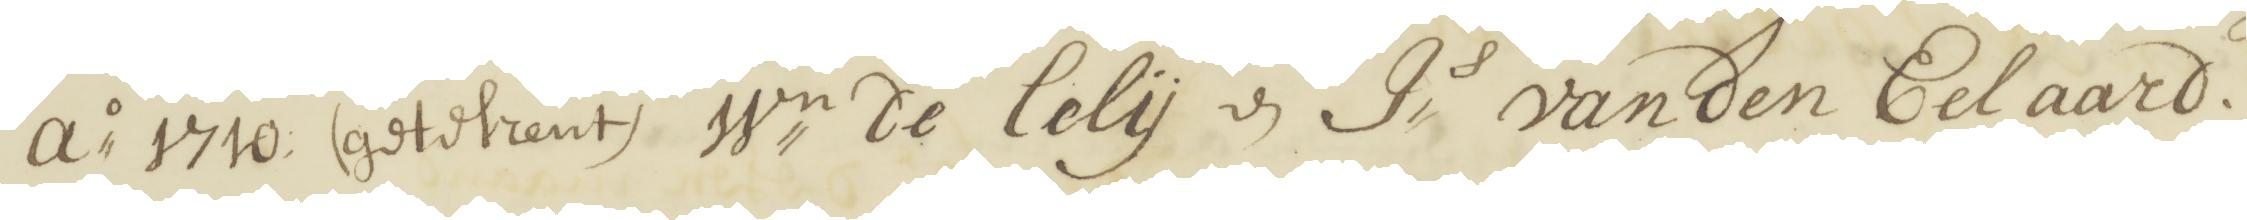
A„o 1710: (getekent) W„m de lelij en I„s van den Eelaard;
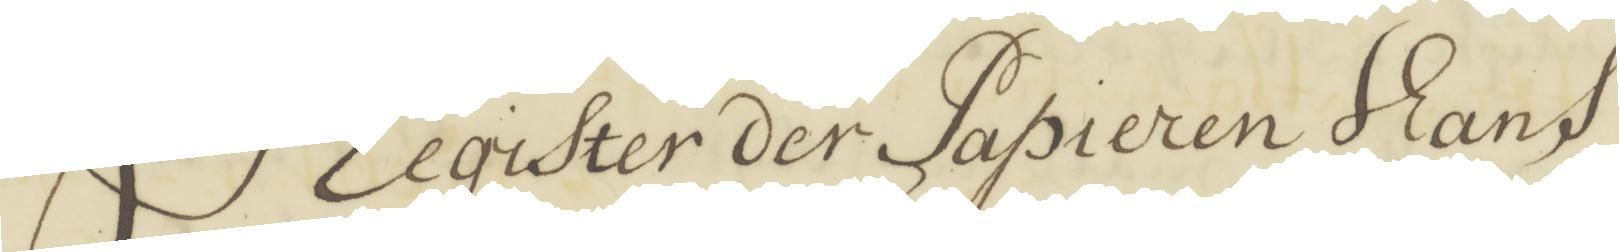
Register der Papieren thans
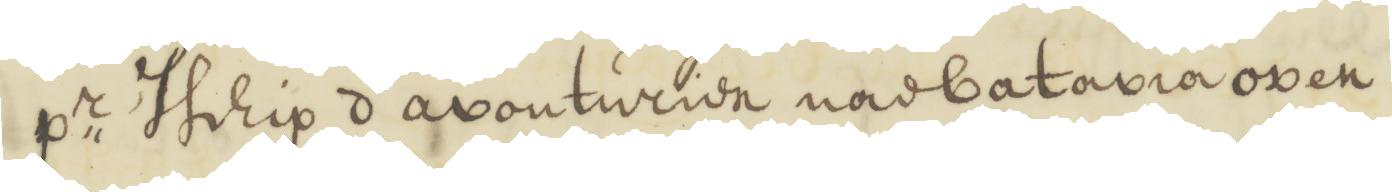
p„r 'tschip d’avonturier naebatavia over
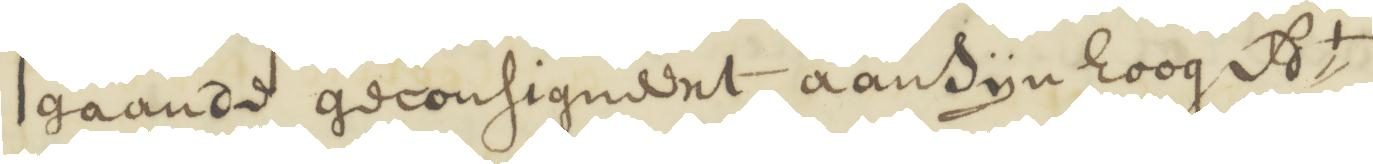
gaande geconsigneert, aansijn hoog Ed„t
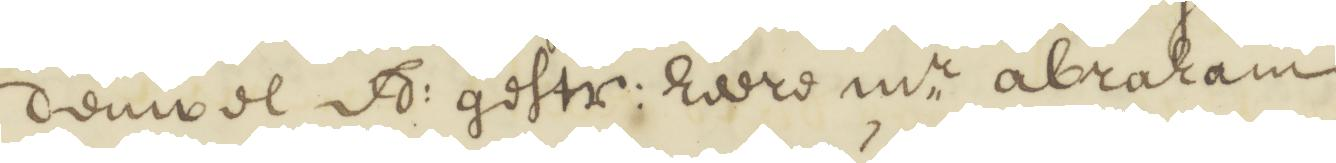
denwel Ed: gestr: heere m„r abraham
